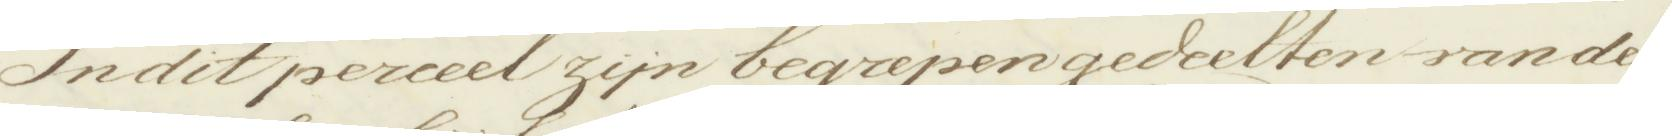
In dit perceel zijn begrepen gedeelten van de
